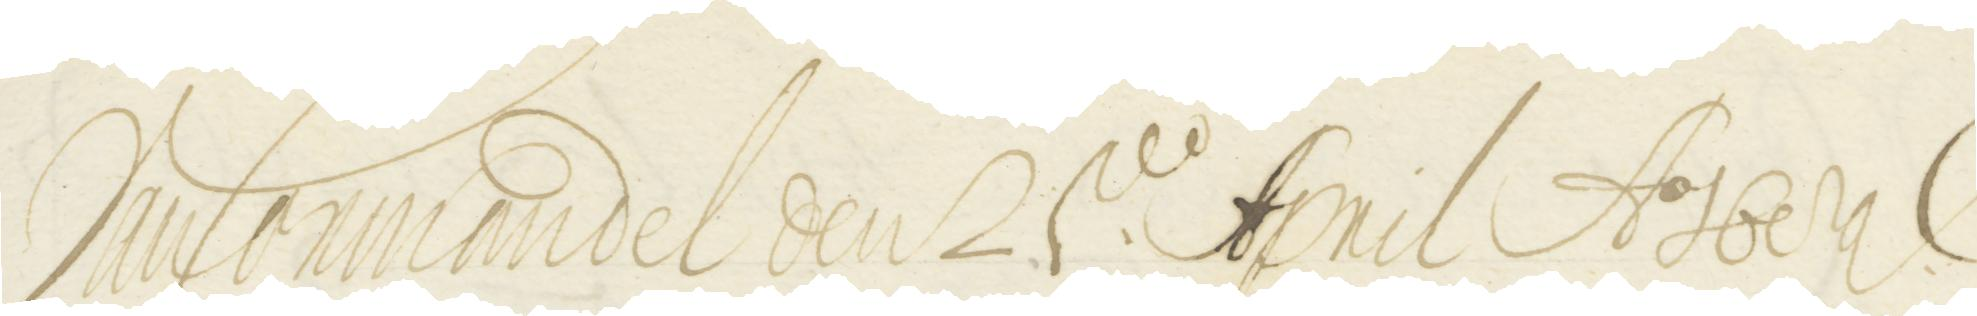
Van Cormandel den 2.5.e April Ao 1684.
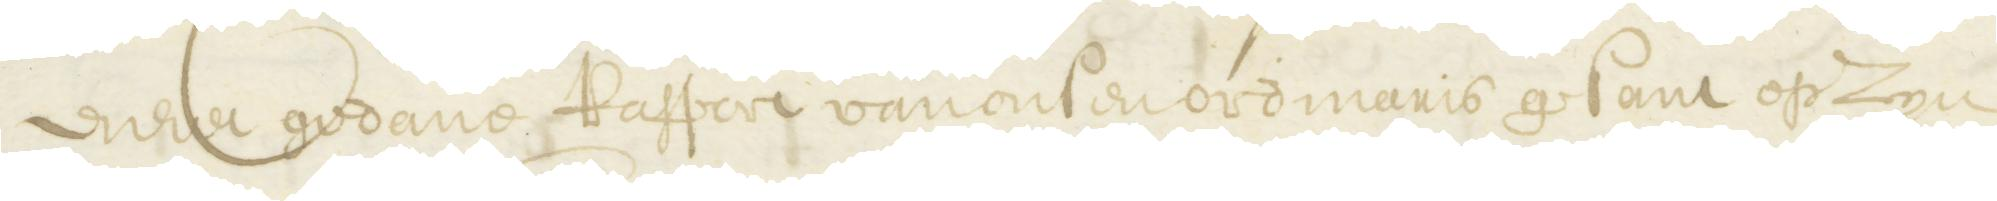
en het gedane rapport van onsen ordinaris gesant op zyn
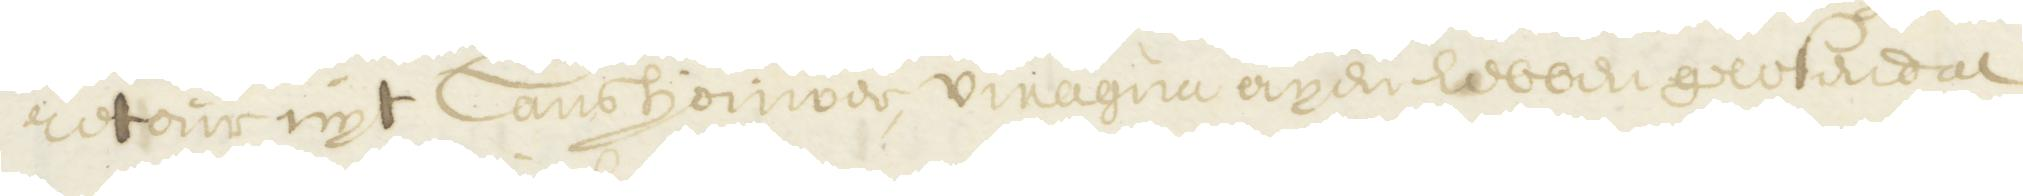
retour uijt Canstjoimer, viragua eryen hebben gewesen dat
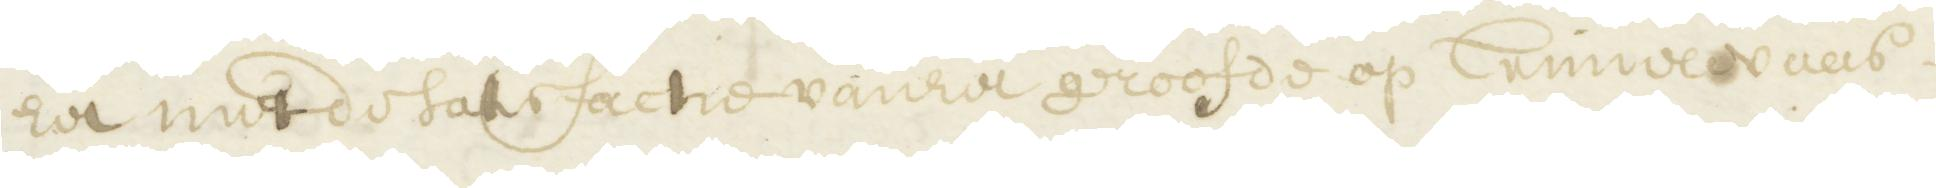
het met de satisfactie van het geroofde op Trimelevaas
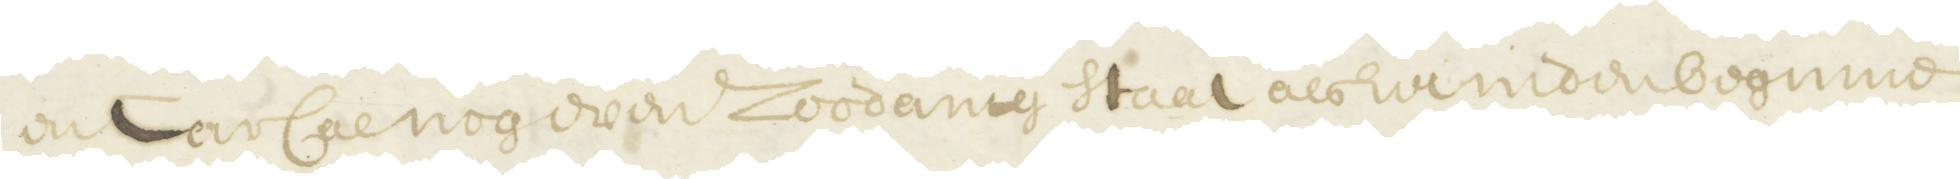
en Carcal nog even zoodanig staat als het in den beginne
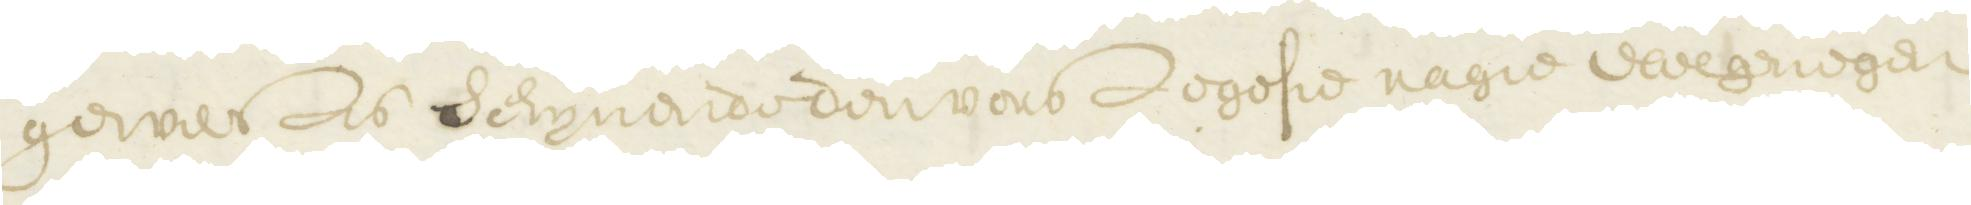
geweestis schijnende den vorst ogesie nagie wel genegen
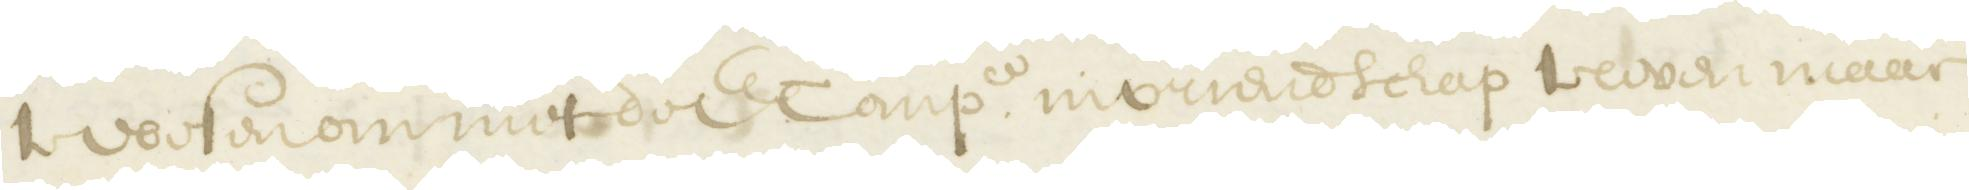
te wesen om met de E Comp:e in vriendschap tleven maar
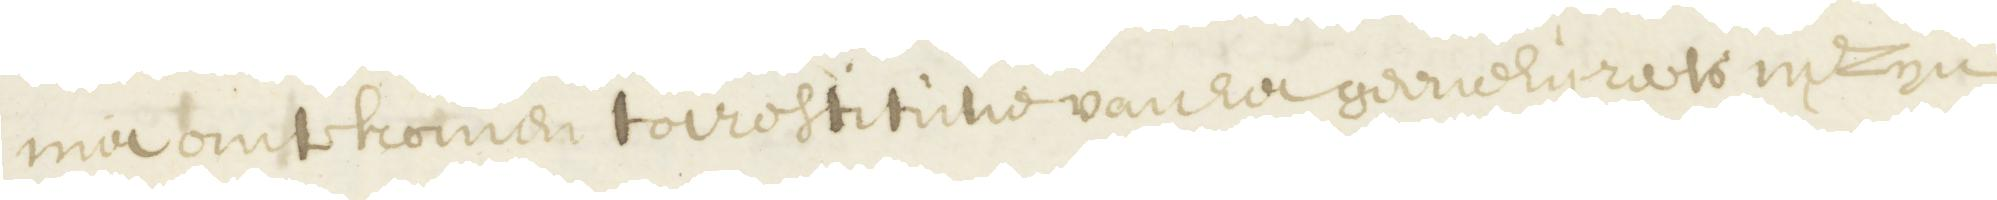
niet om te komen tot restitutie van het geene hij reets in zijn
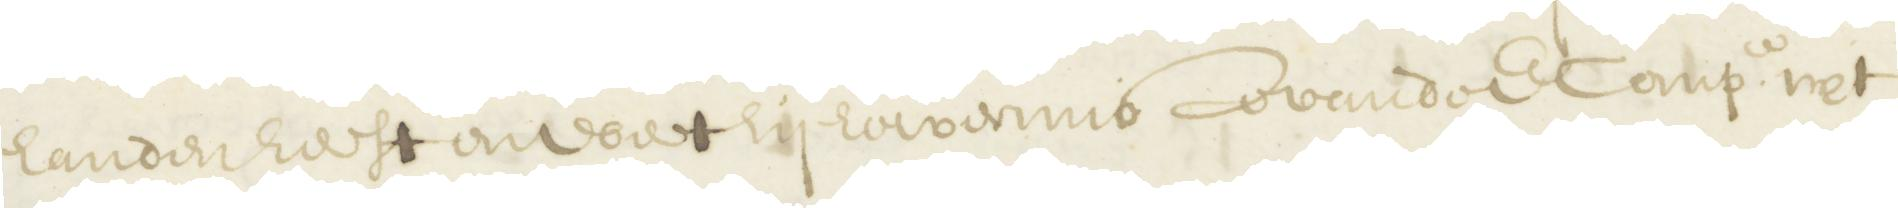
handen heeft en weet hij het vermiste van de E Comp:' tyt
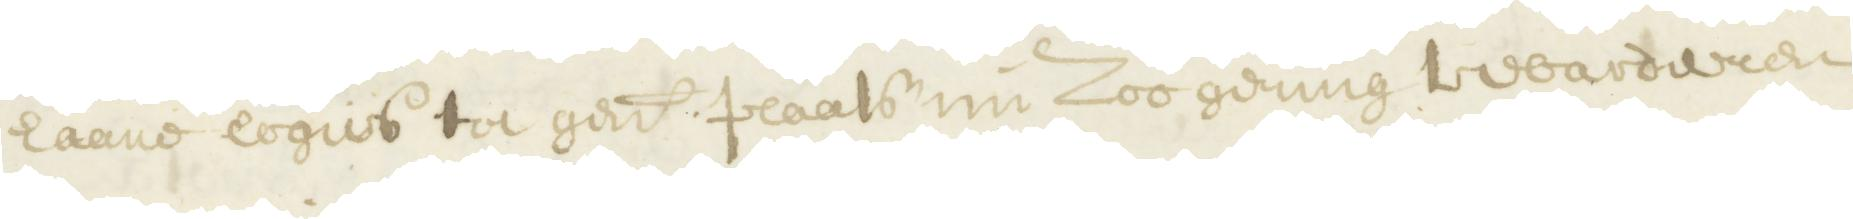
haare logies tot gen: plaats nu zoo gering te wardeeren
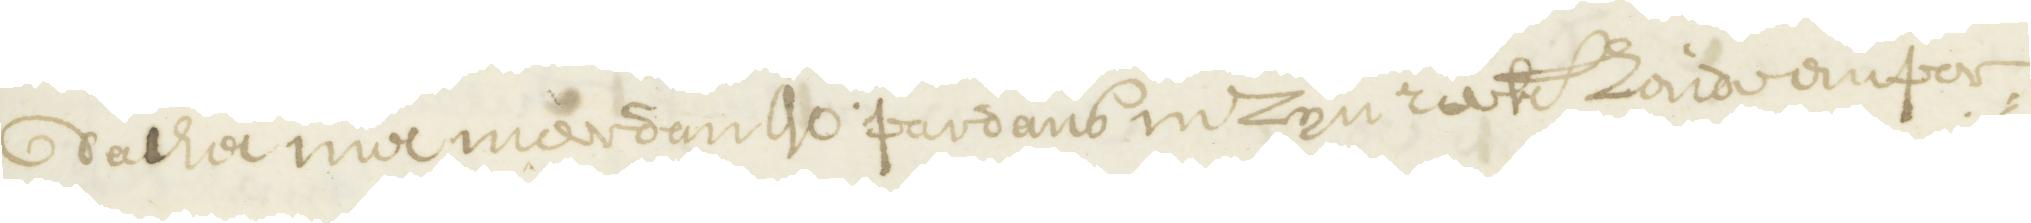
dat het niet meer dan 40. pardaus in zijn reeks zoude empor„
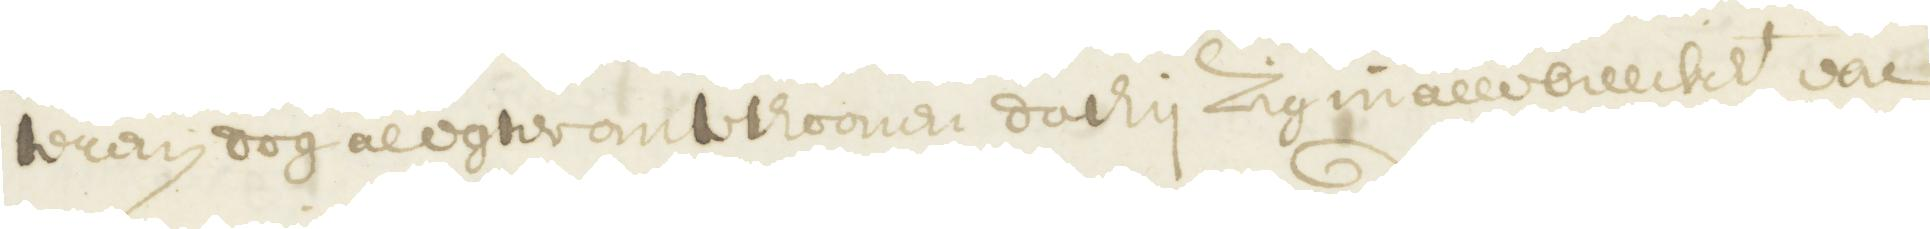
teren, dog al egter om te thoonen dat hij zig in alle billikh,t wil
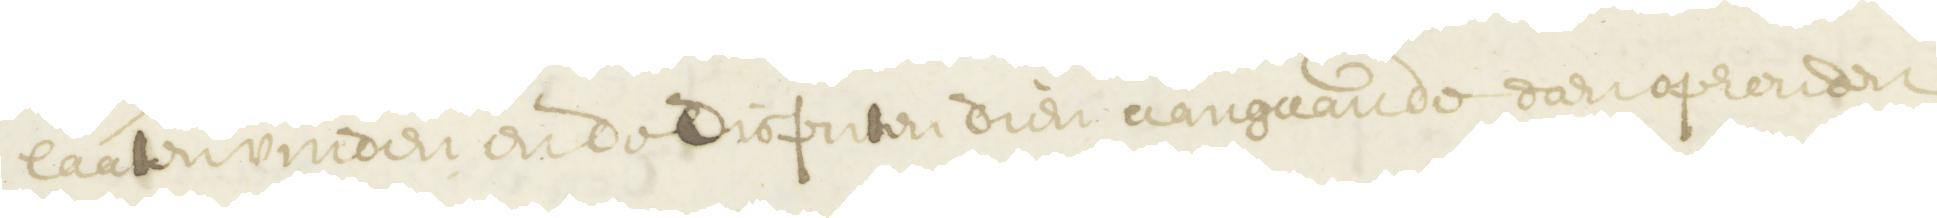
laaten vinden en de disputen dien aangaande daer ophanden
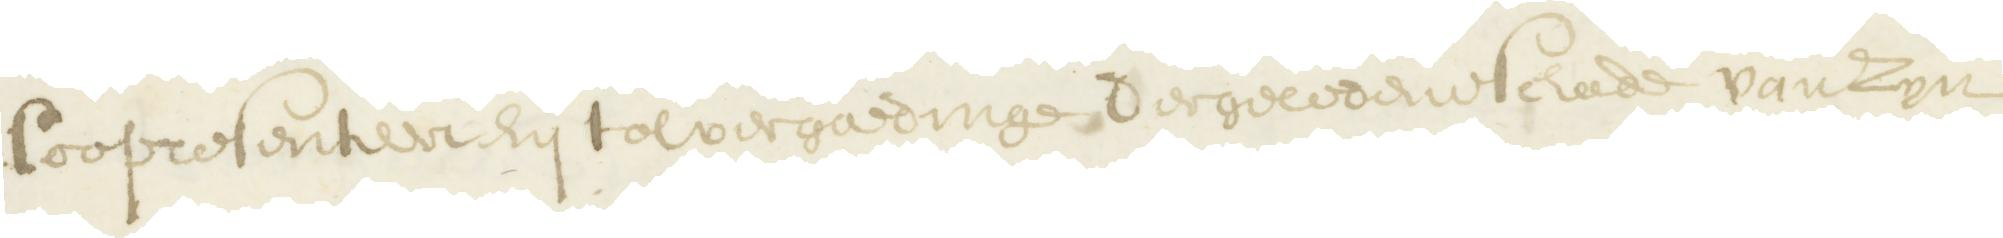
soo presenteert hij tot vergoedinge der geledene scheede van zyn
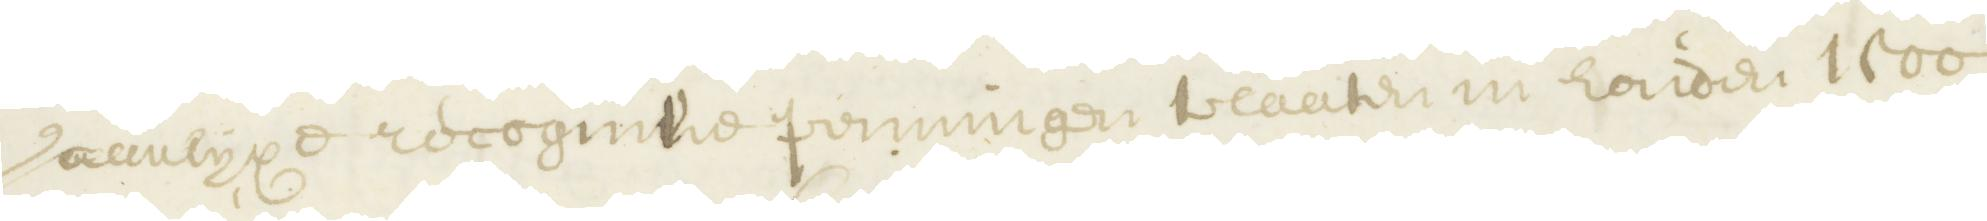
Jaarlijxe recognitie penningen te laaten in houden 1500
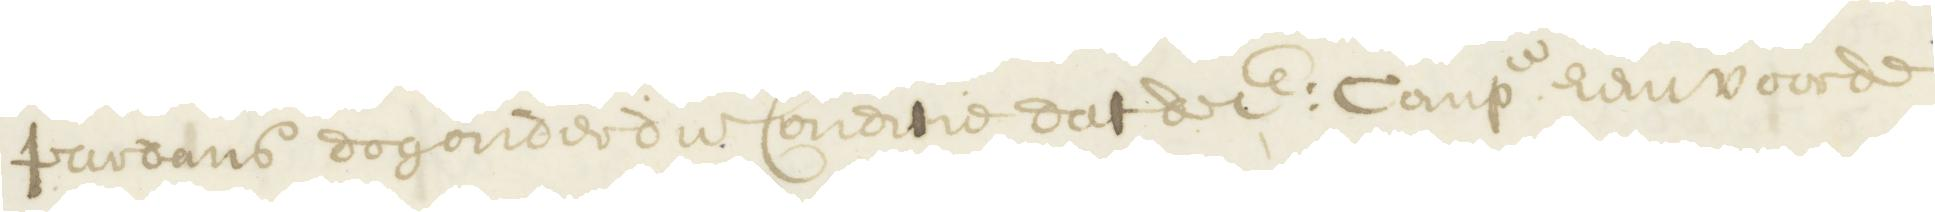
pardaus dog onder die Conditie dat de E: Comp:e hem voorde
